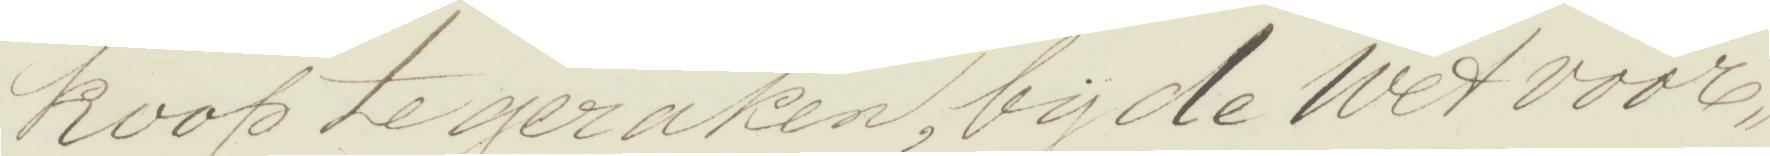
Koop te geraken, bij de wet voor„
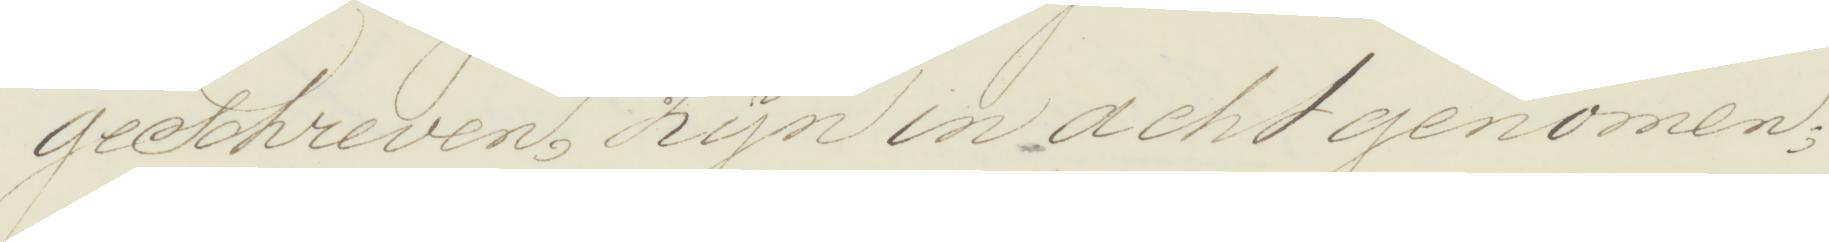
geschreven zijn in acht genomen;
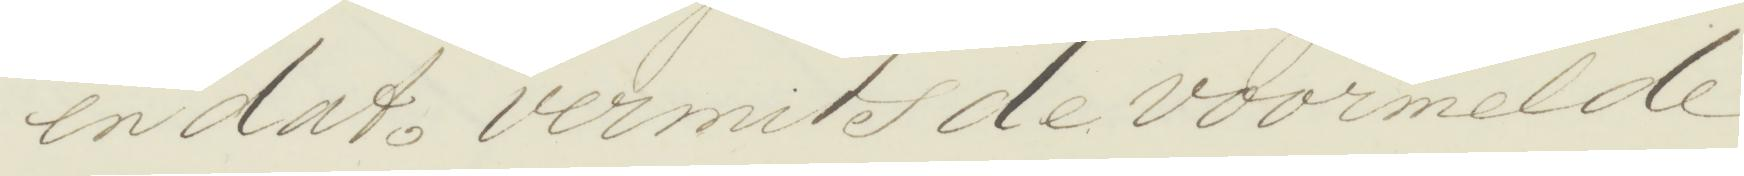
en dat, vermits de voormelde
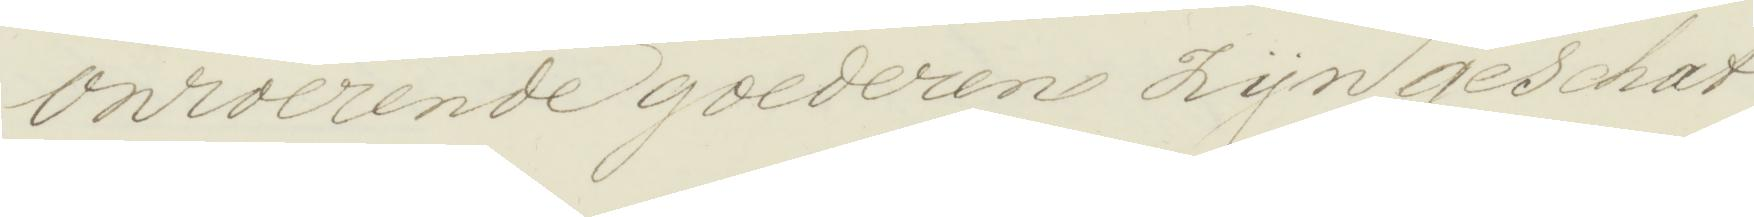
onroerende goederen zijn geschat
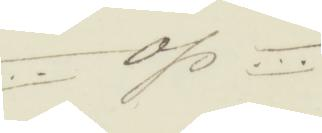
.. op ..
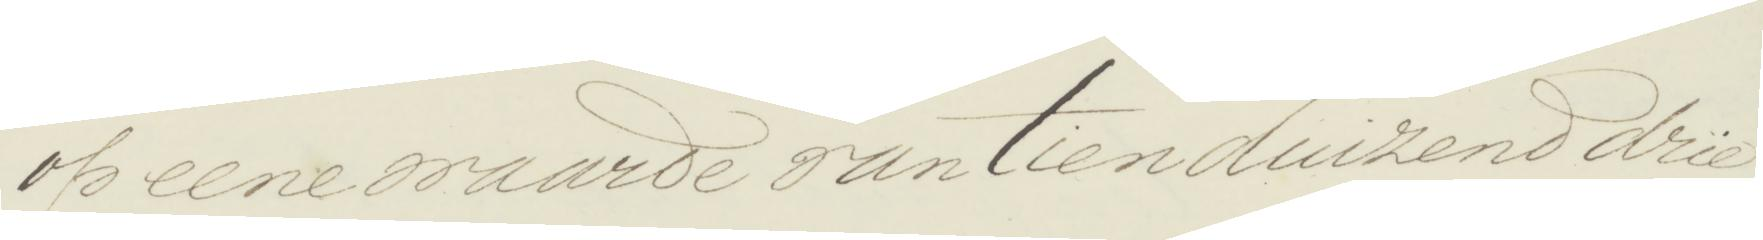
op eene waarde van tien duizend drie
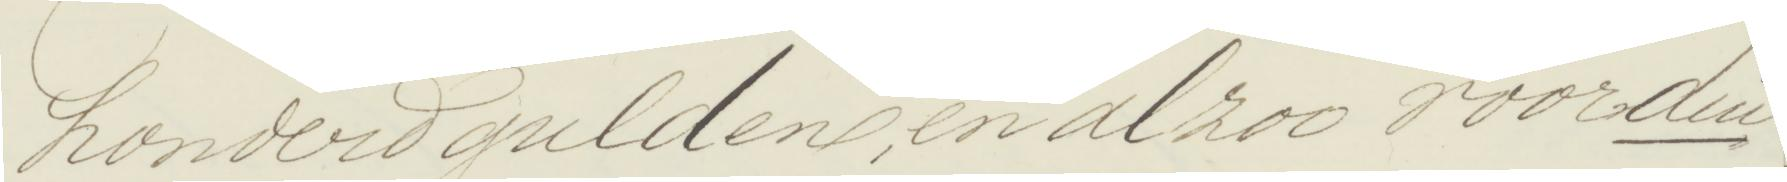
honderd gulden, en alzoo voor dui
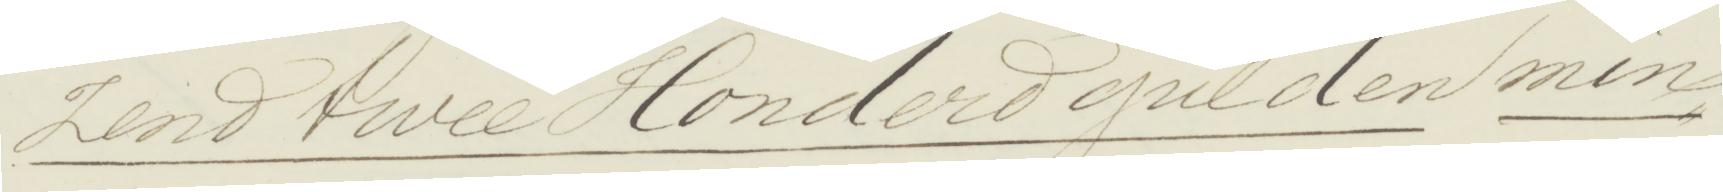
zend twee Honderd gulden min
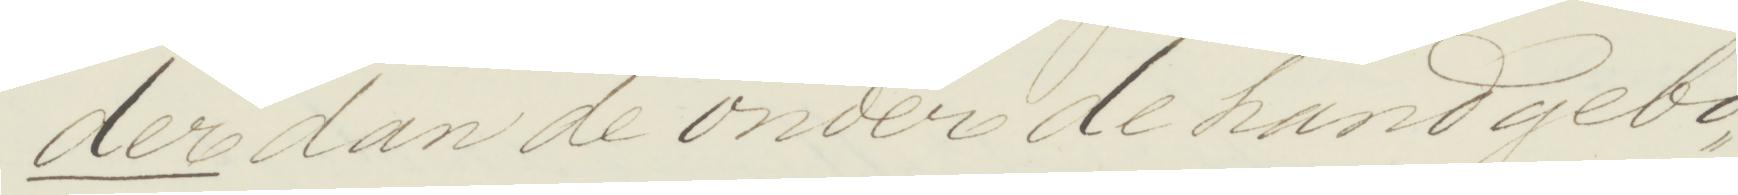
der dan de onder de handgebo„
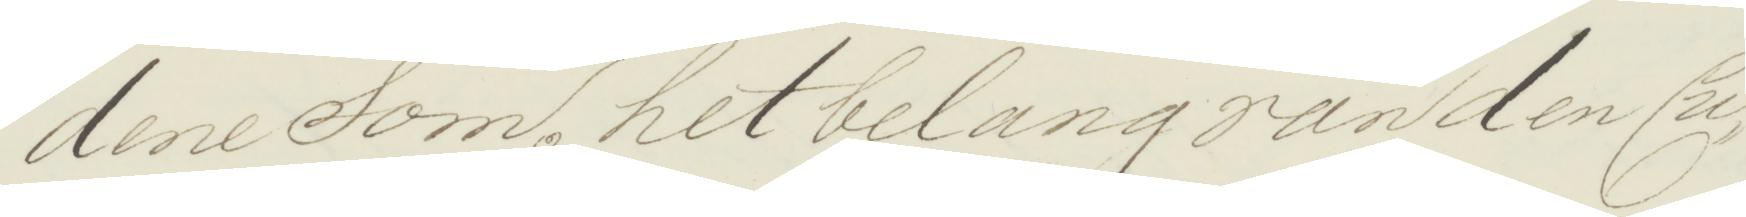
dene Som, het belang van den Cu„
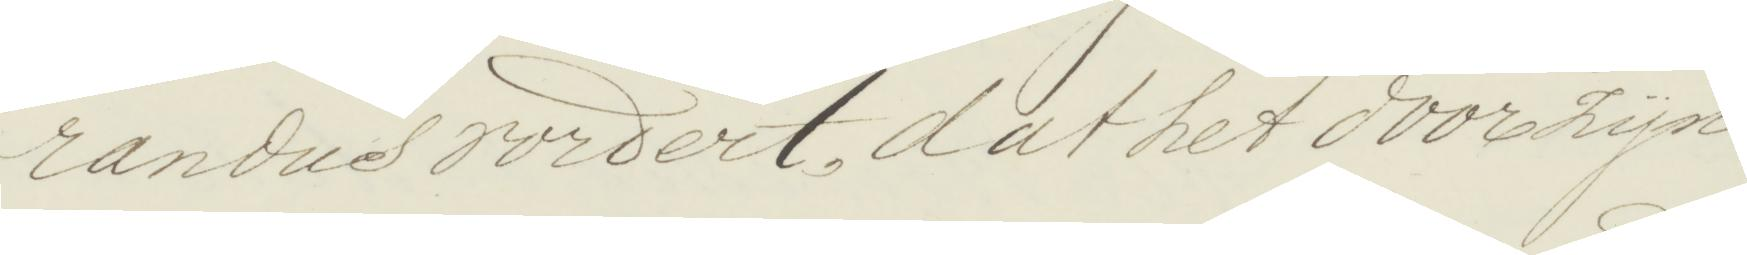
randus vordert, dat het door zijn
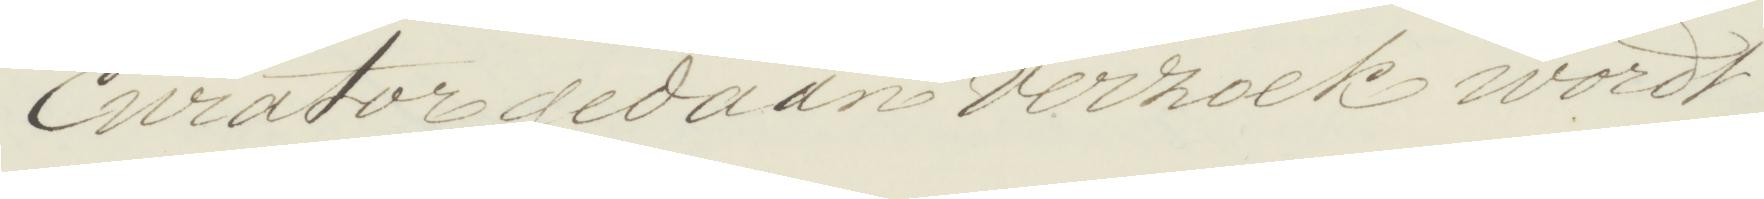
Curator gedaan verzoek wordt
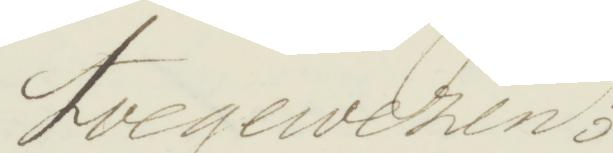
toegewezen;
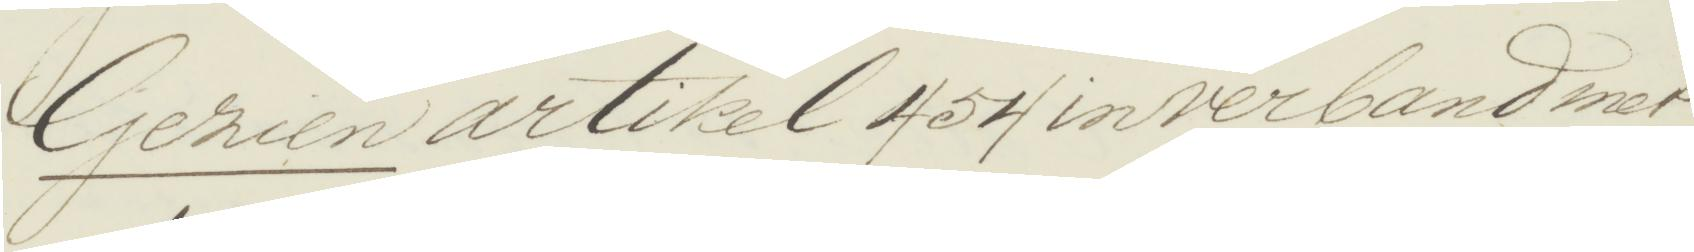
Gezien artikel 454 in verband met
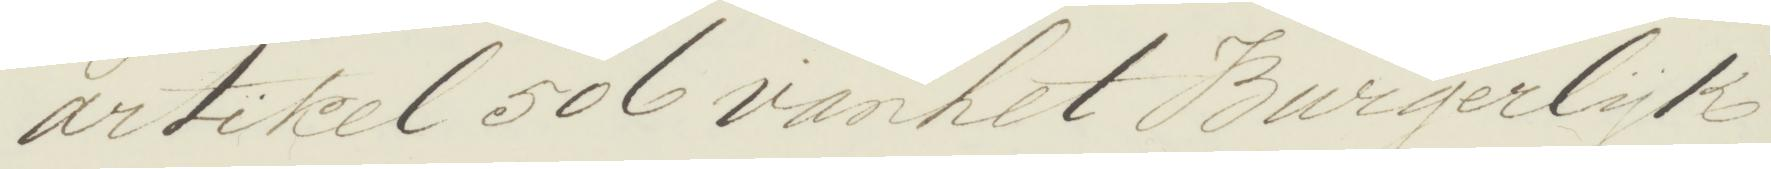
artikel 506 van het Burgerlijk
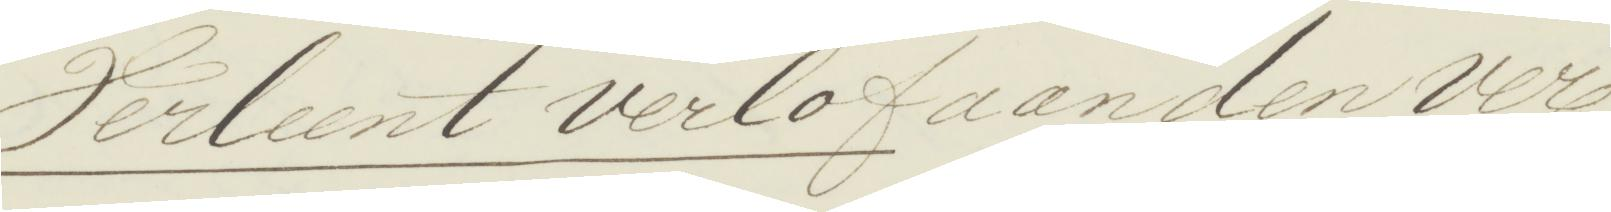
Verleent verlof aan den ver
